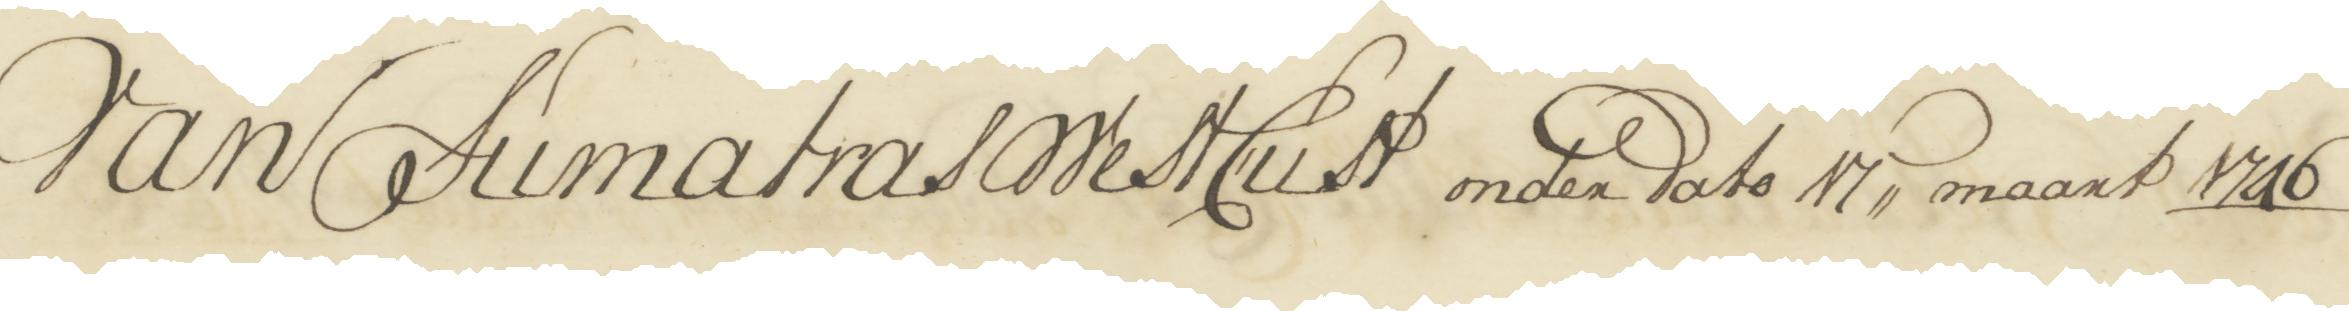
Van Sumatras WestCust onder dato 17„' maart 1746
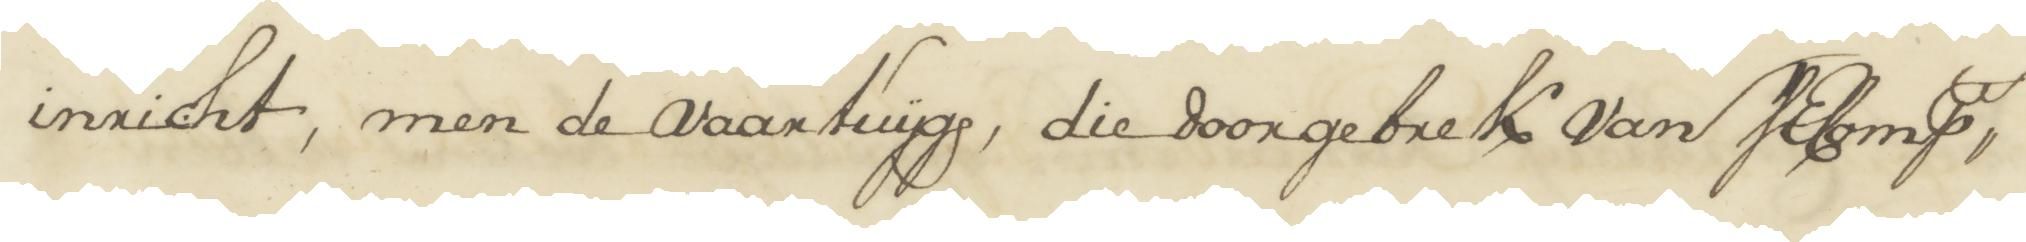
inricht, men de vaartuijge, die door gebrek van 'sEComp„es
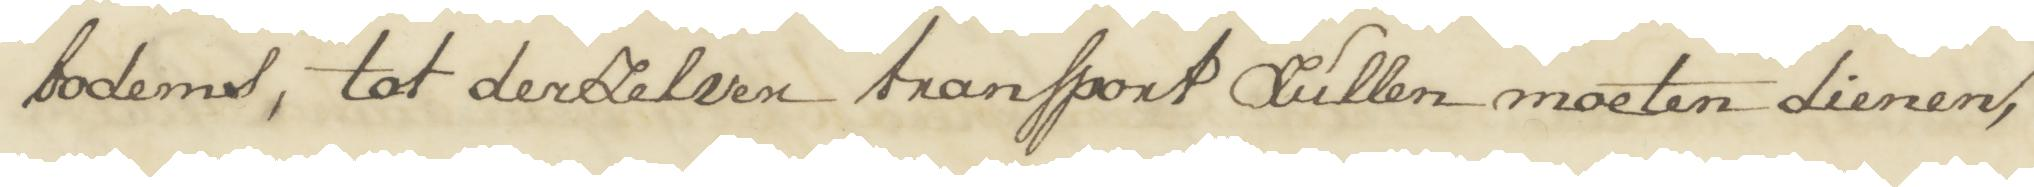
bodems, tot denzelven transport zullen moeten dienen,
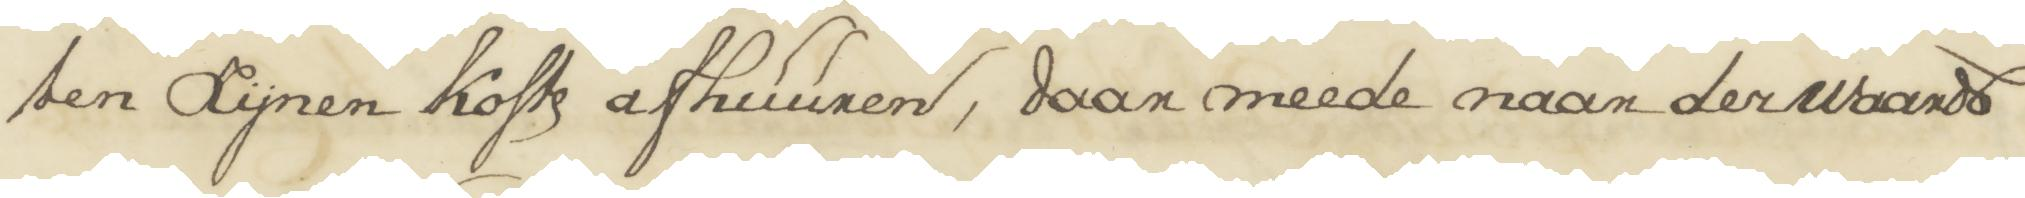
een zijnen koste afhuuren, daar meede naar derwaards
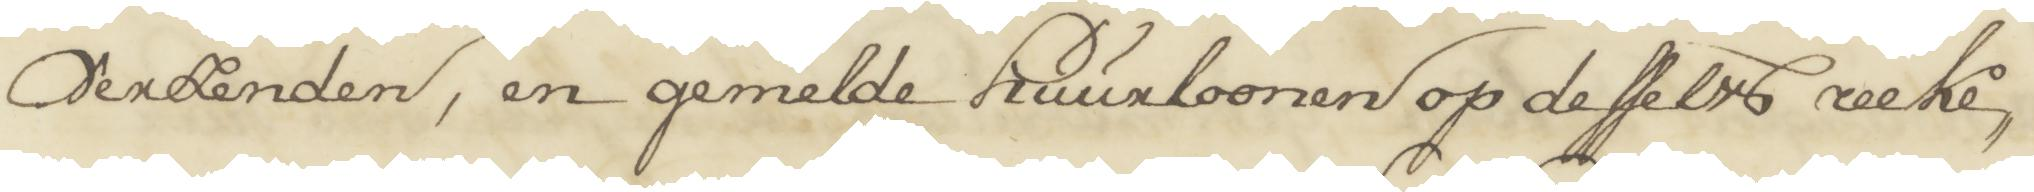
verzenden, en gemelde huurloonen op desselvs reeke„
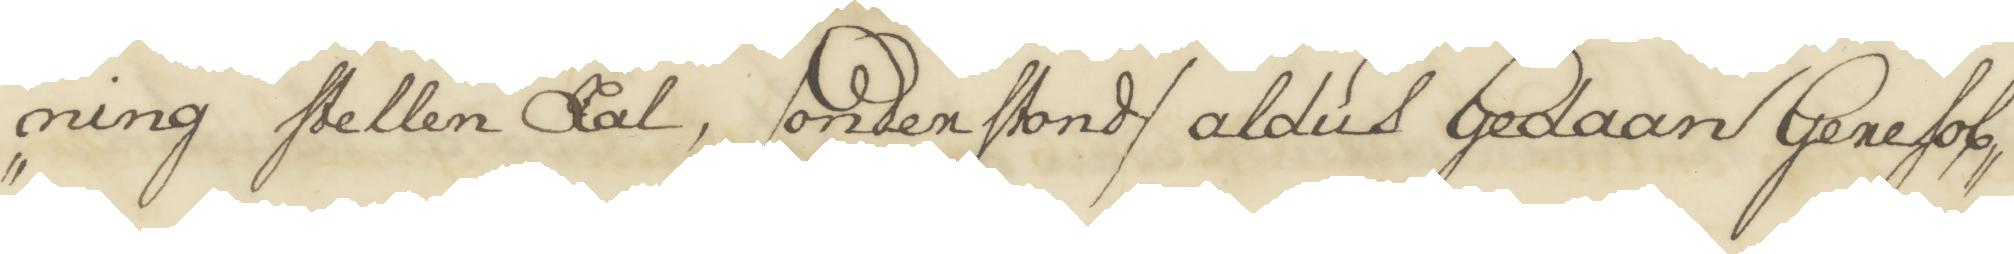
„ning stellen zal, /onderstond/ aldus Gedaan Geresol„
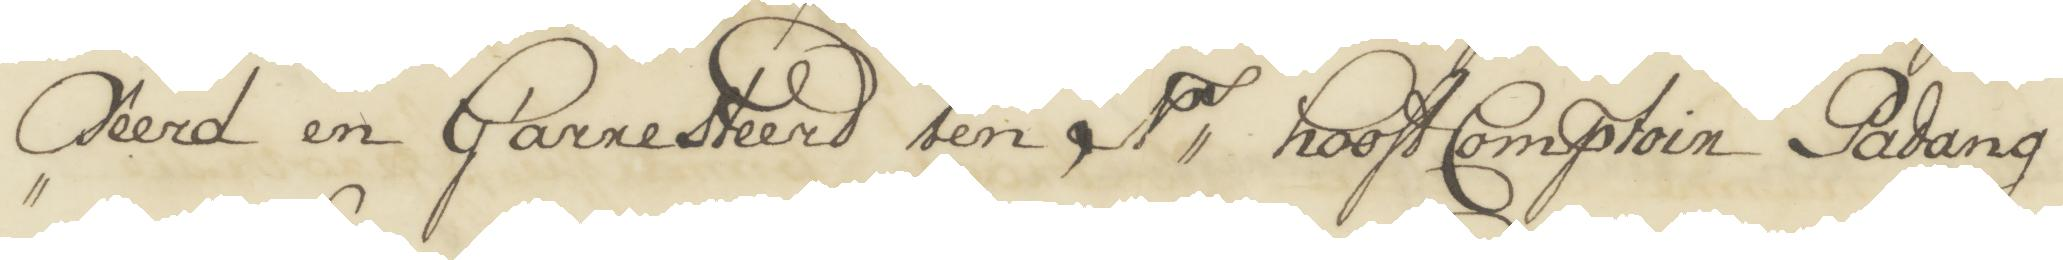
„veerd en G'arresteerd ten p„s Hooft Comptoir Padang
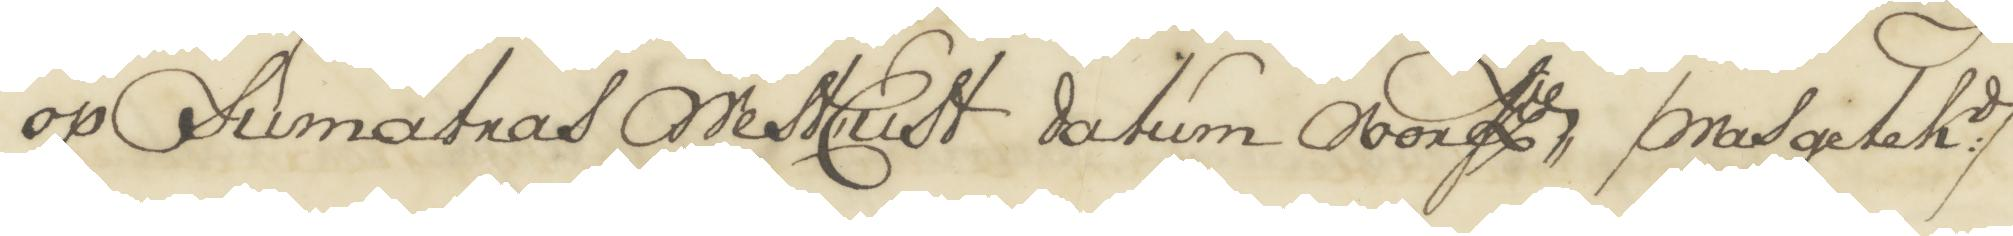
op Sumatras WestCust datum voorszien„ /was getek:d/
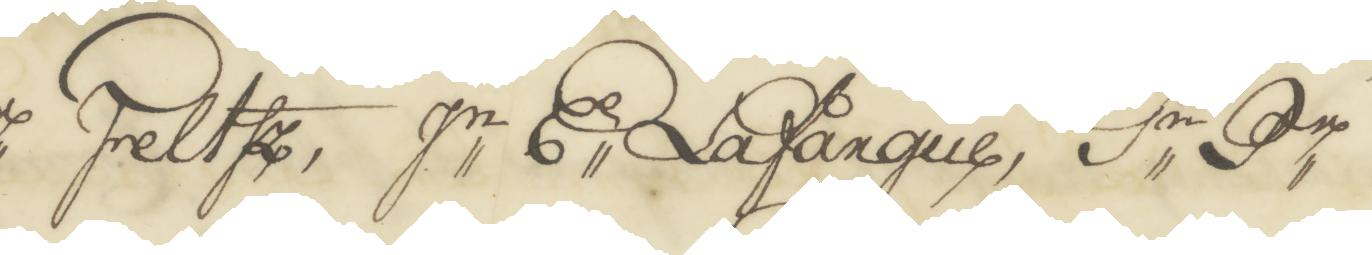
C„n W„m V„n d„r Feltsz, J„n C„en Lafargue, T„n P„r
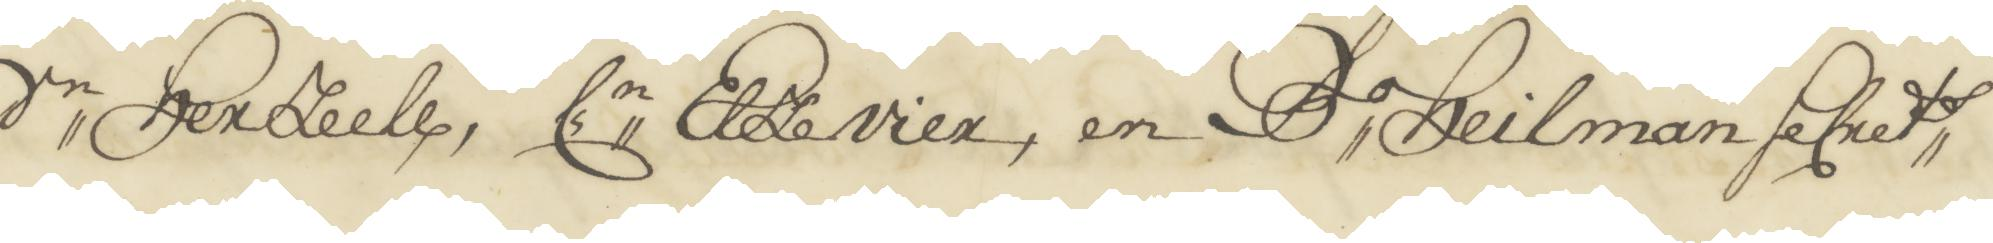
v„n Herzeele, C„n Elzevier, en B:o Heilman Sect„s
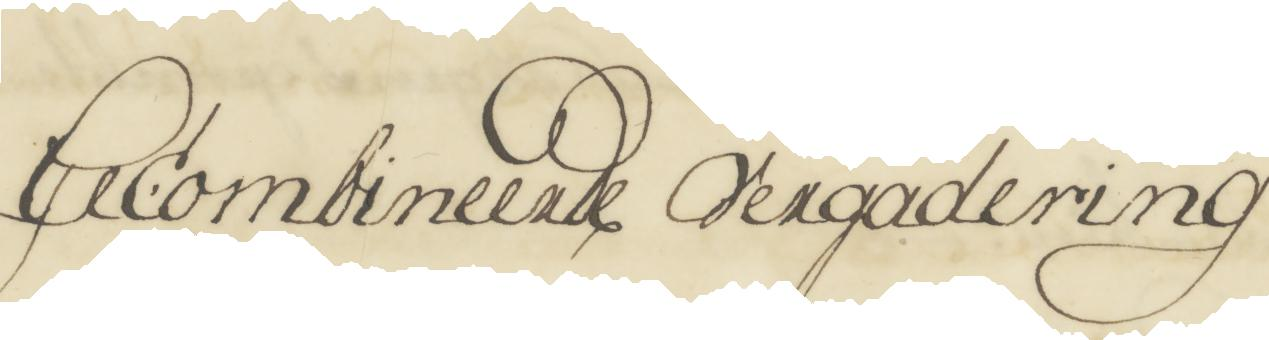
Gecombineerde vergadering
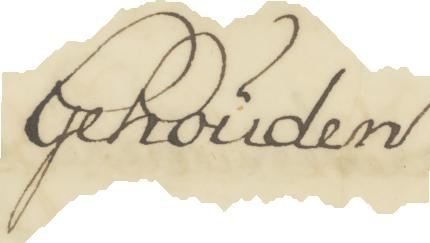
Gehouden
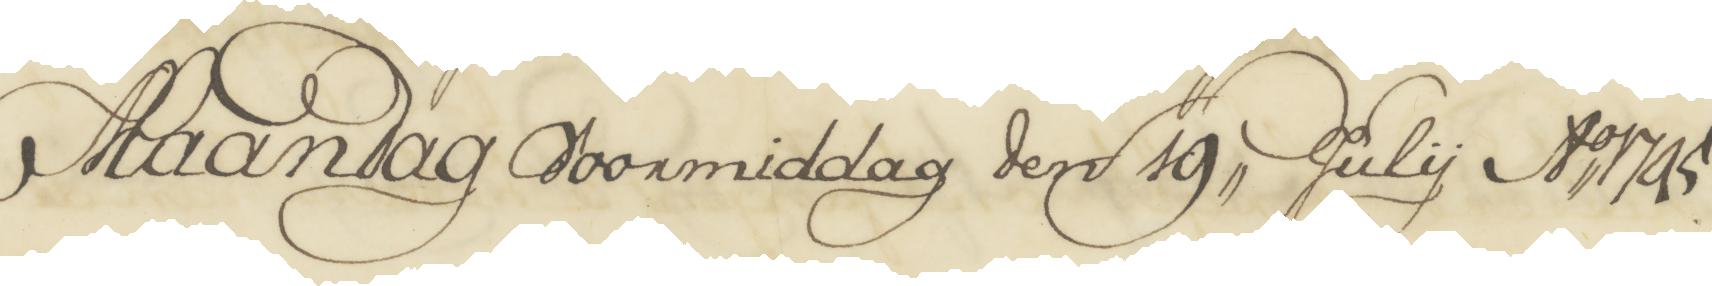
Maandag voormiddag den 19„ Julij A„o 1745
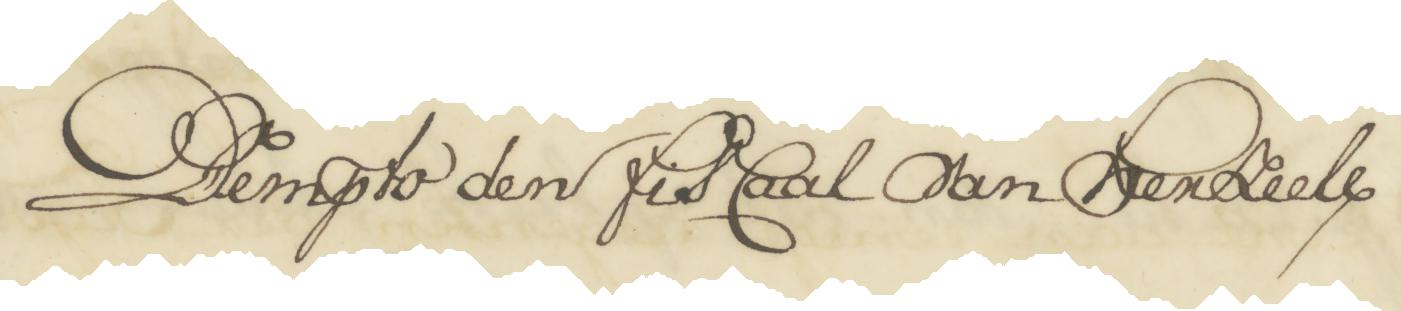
Dempto den fiscaal van Herzeele
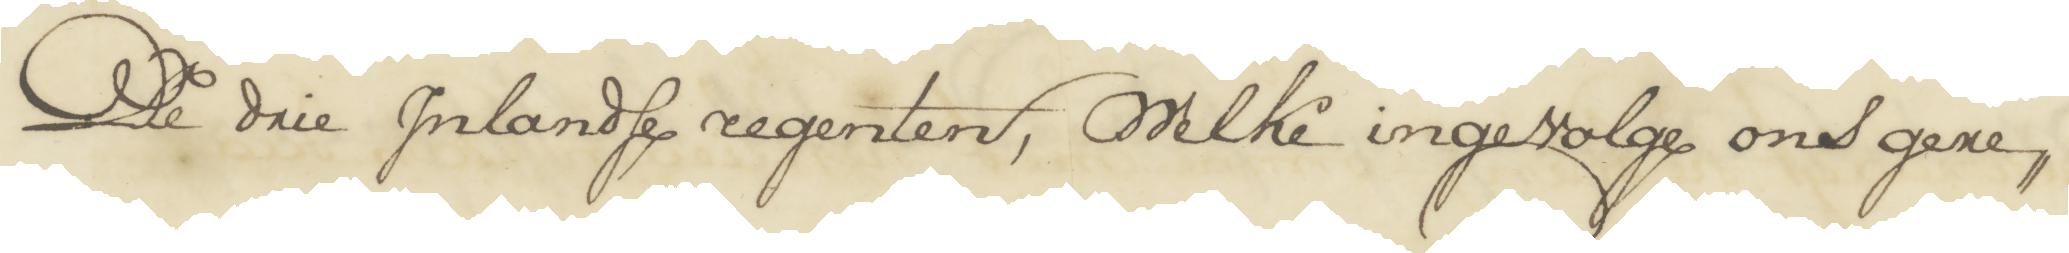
De drie Jnlandse regenten, Welke ingevolge ons gere„
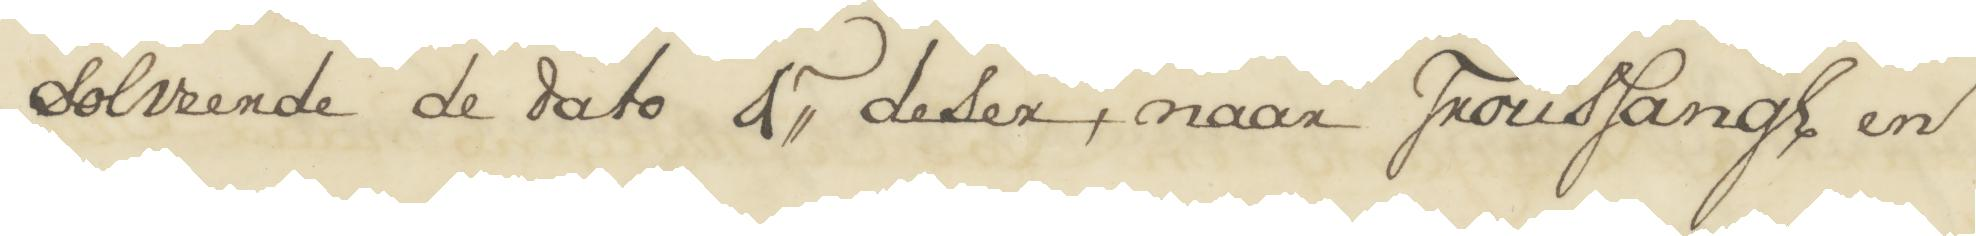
solveerde de dato 4„' deser, naar Troussangh en
